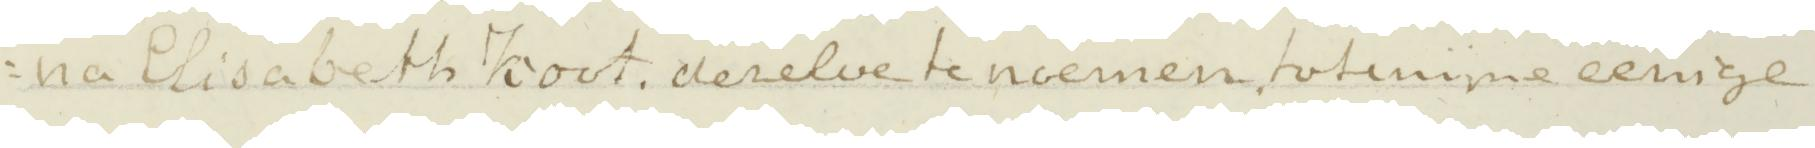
=na Elisabeth Koot, dezelve te noemen, tot mijne eenige
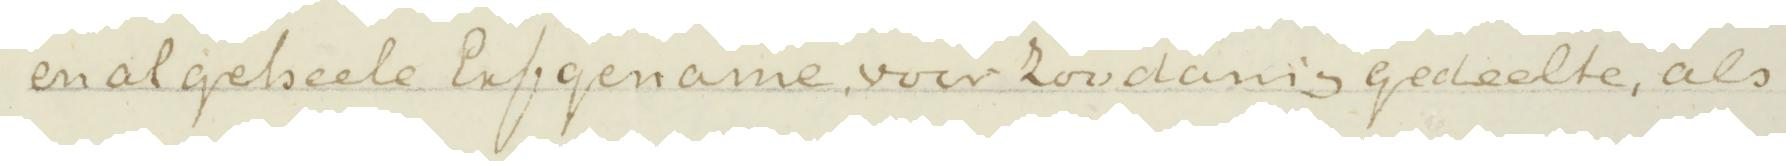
en algeheele Erfgename, voor zoodanig gedeelte, als
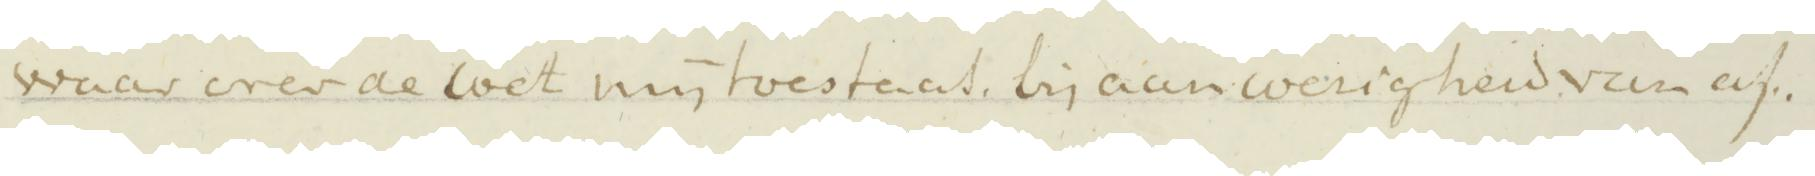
waar over de wet mij toestaat, bij aanwezigheid van af„
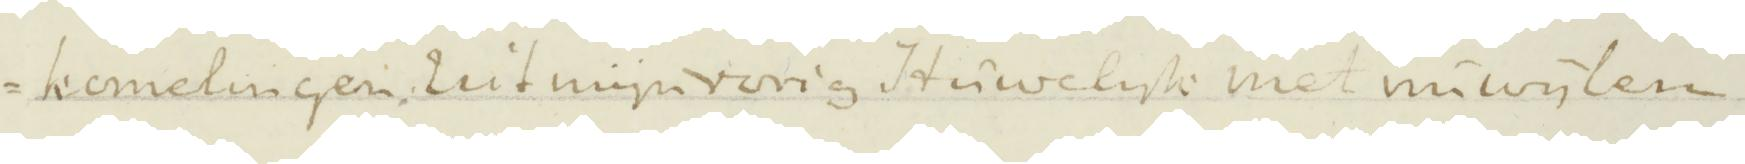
=komelingen, uit mijn vorig Huwelyk met nu wijlen
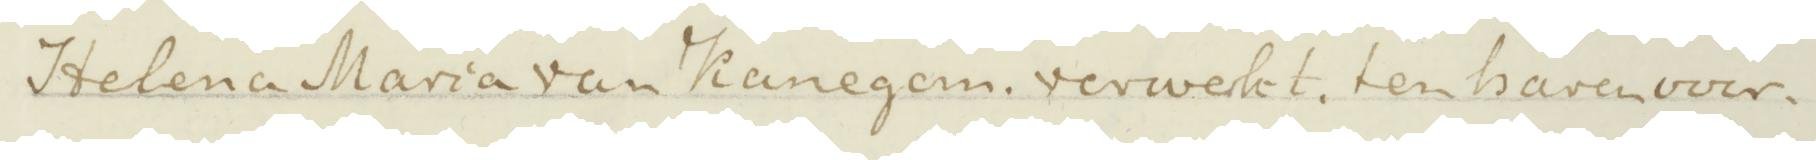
Helena Maria van Kanegom, verwekt, ten haren voor-
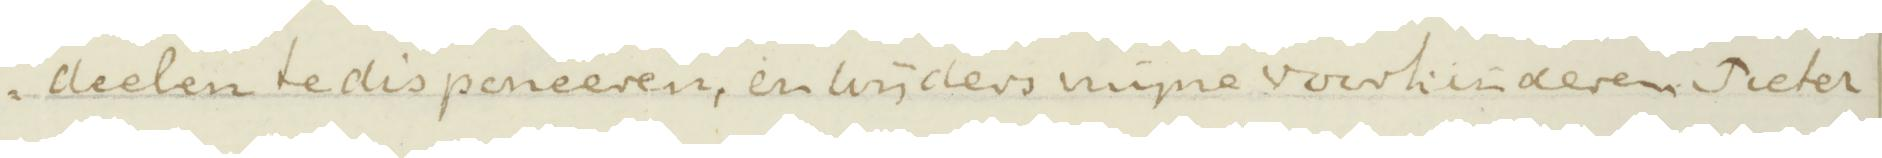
„deelen te disponeeren, en wijders mijne voorkinderen Pieter
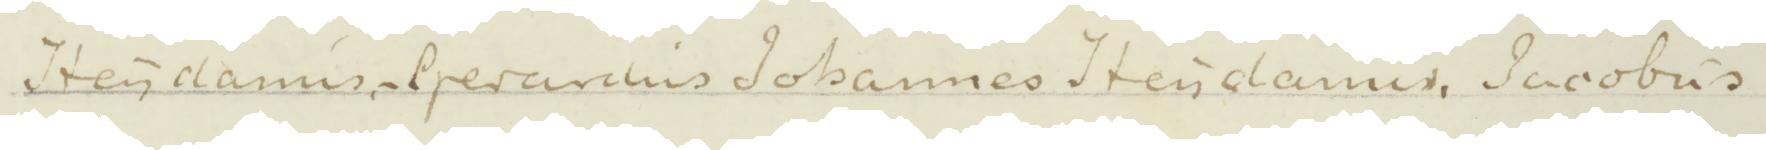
Heijdanus, Gerardus Johannes Heijdanus, Jacobus
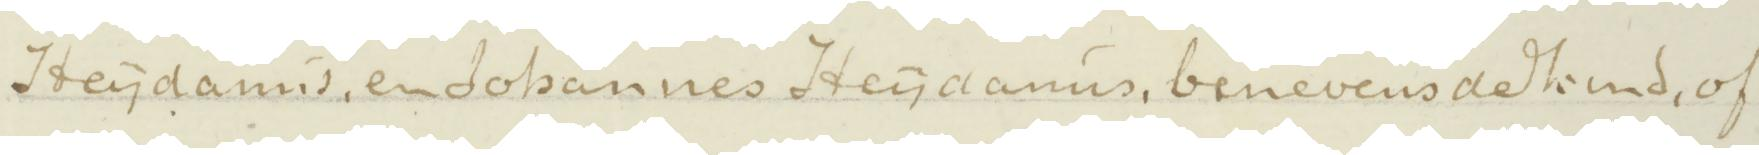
Heijdanus, en Johannes Heijdanus, benevens de kind, of
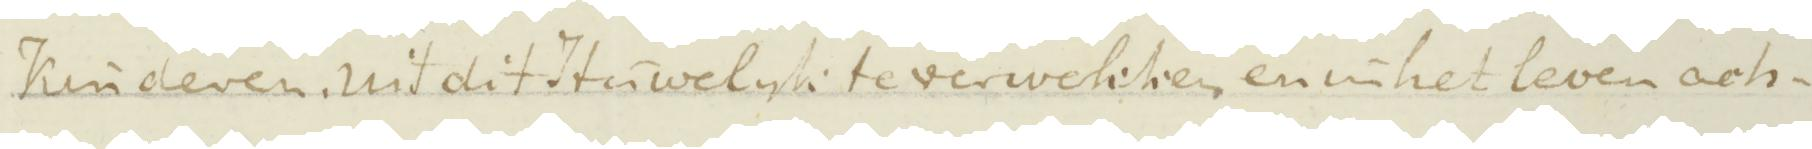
kinderen, uit dit Huwelijk te verwekken en in het leven ach-
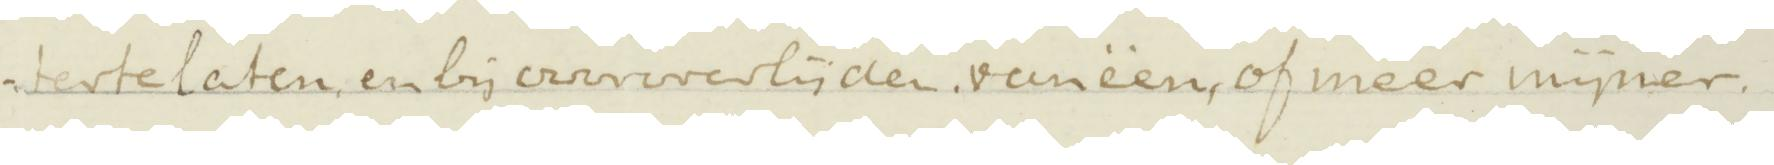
ter te laten, en bij vooroverlijden van één of meer mijner
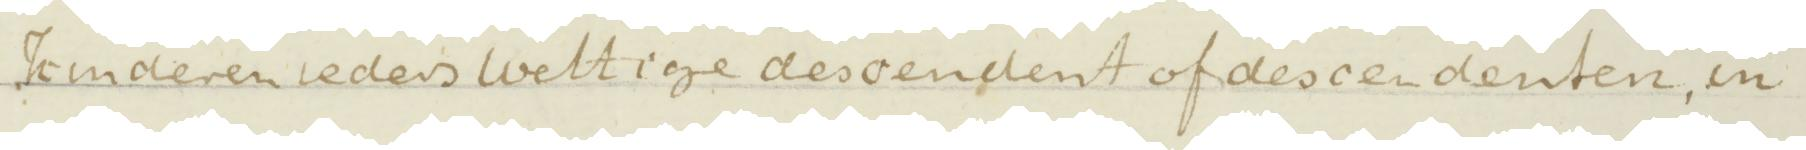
kinderen ieders wettige descendent of descen enten, in
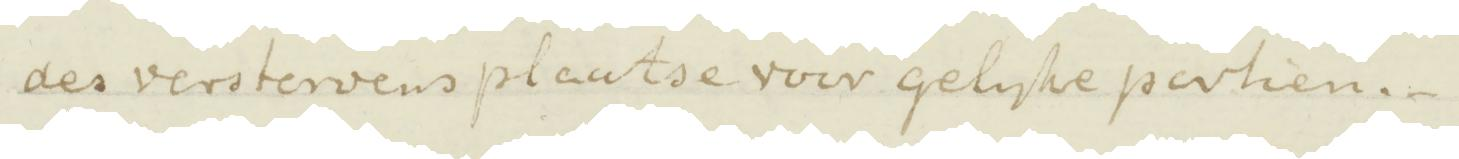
des verstervens plaatse voor gelyke partien._
